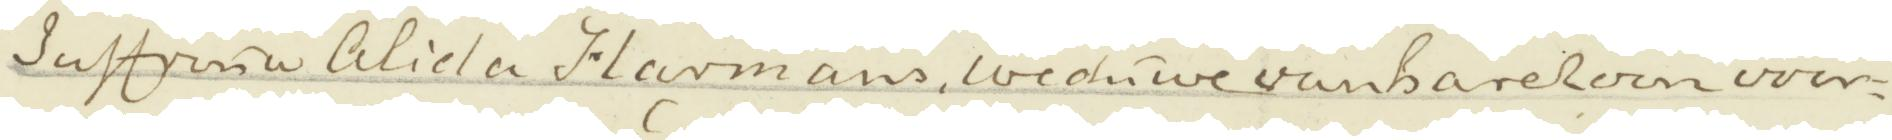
Juffrouw Alida Harmans, weduwe van hare zoon voor=
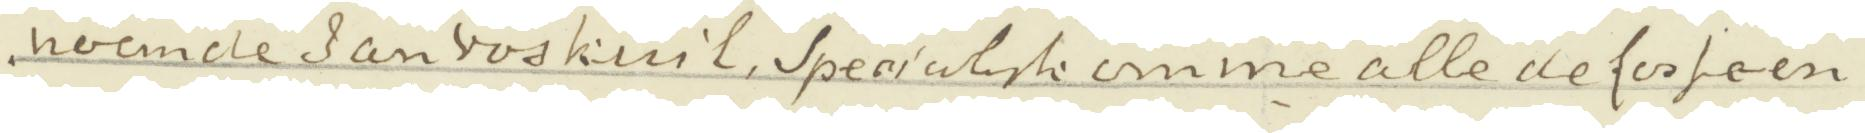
„noemde Jan Voskuil, specialyk omme alle de losse en
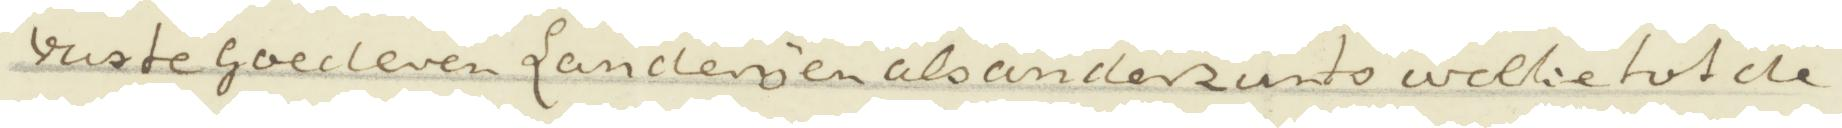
vaste goederen Landerijen als anderzints welke tot de
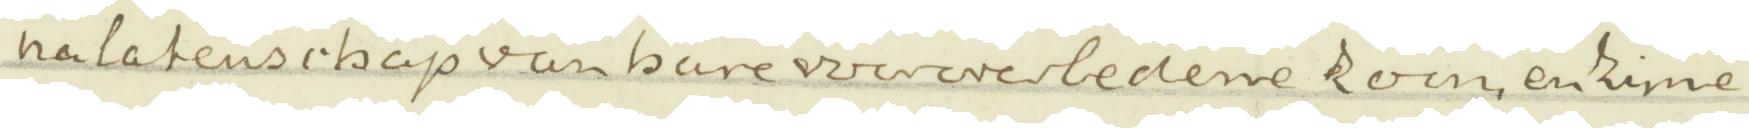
nalatenschap van hare vooroverledene Zoon en Zijne
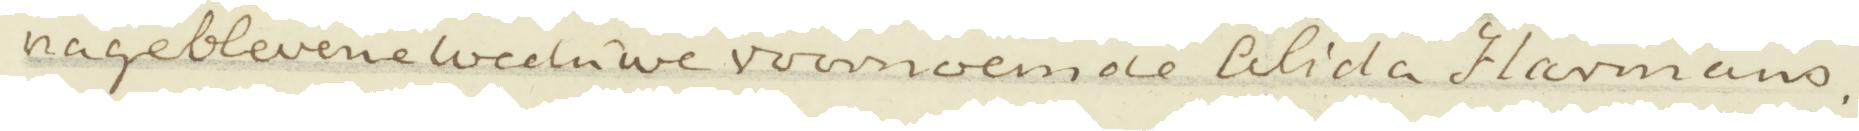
nageblevene weduwe voornoemde Alida Harmans,
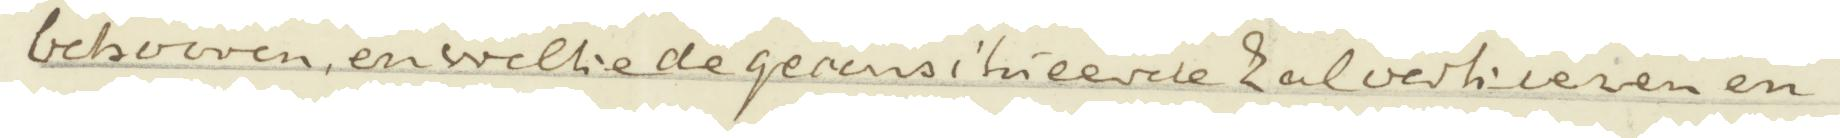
behooren, en welke de geconsitueerde Zal versilveren en
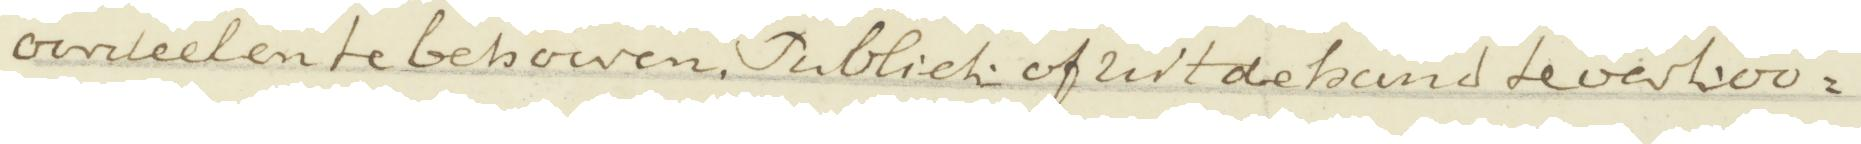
oordeelen te behooren, Publiek of uit de hand te verkoo=
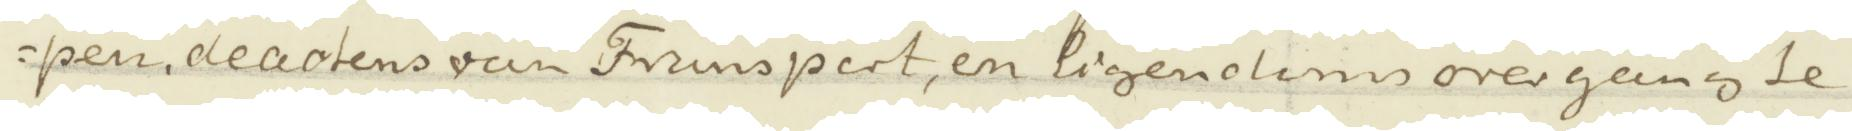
=pen de actens van Transport, en Eigendoms overgang te
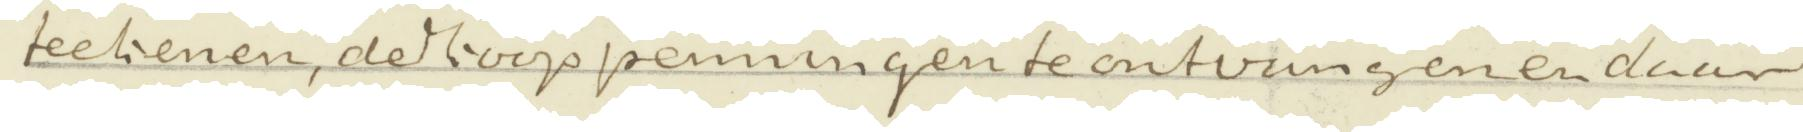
teekenen, de koop penningen te ontvangen en daar
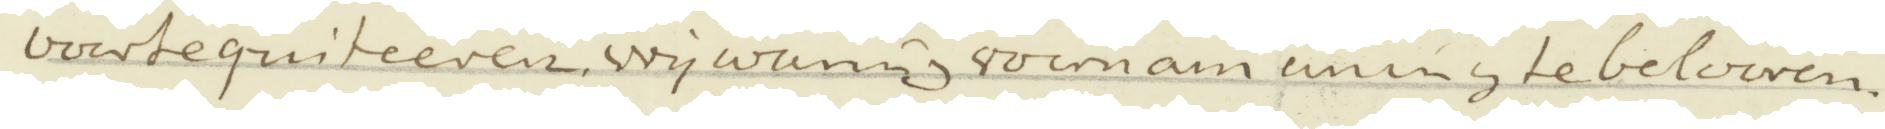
voor te quiteeren vrijwaring voor namaning te belooven.
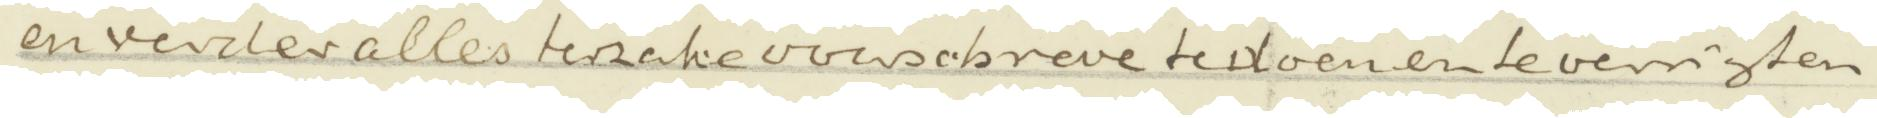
en verder alles terzake voorschreve te doen en te verrigten
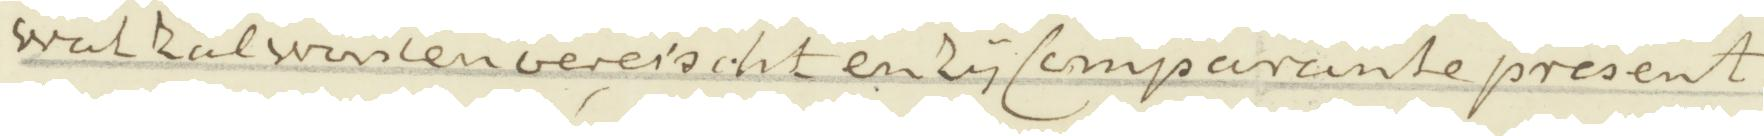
wat zal worden vereischt en zij Comparante present
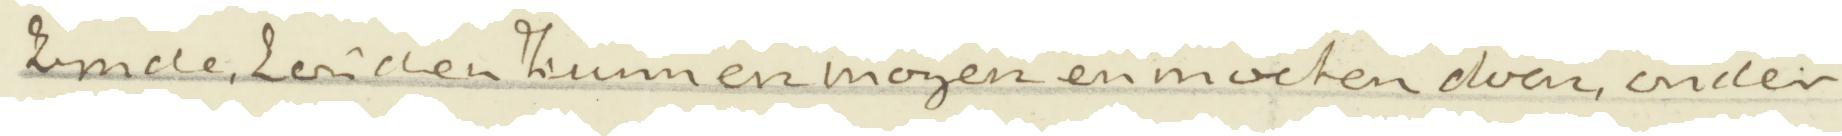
zynde Zouden kunnen mogen en moeten doen, onder
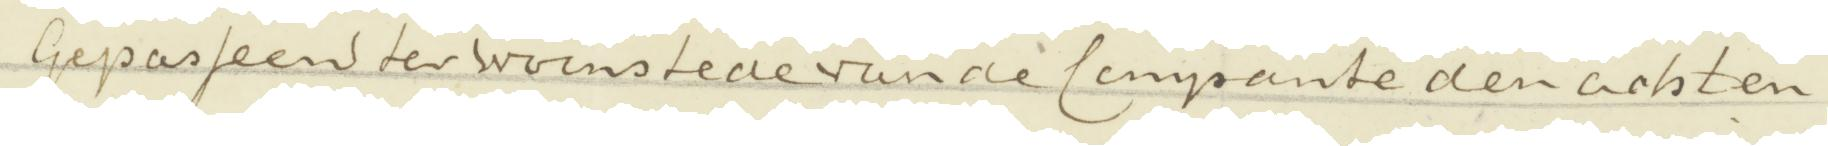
gepasseerd ter woonstede van de Comparante den achten
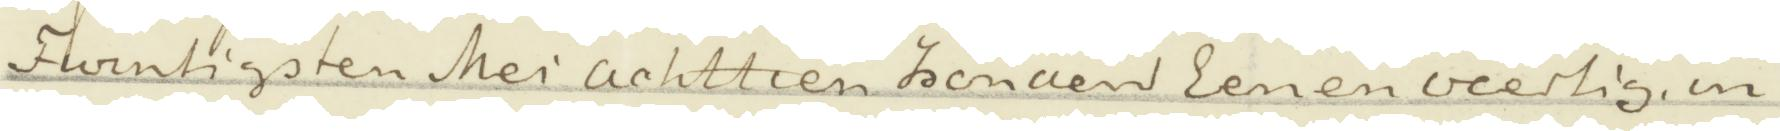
Twintigsten Mei achttien honderd Een en veertig in
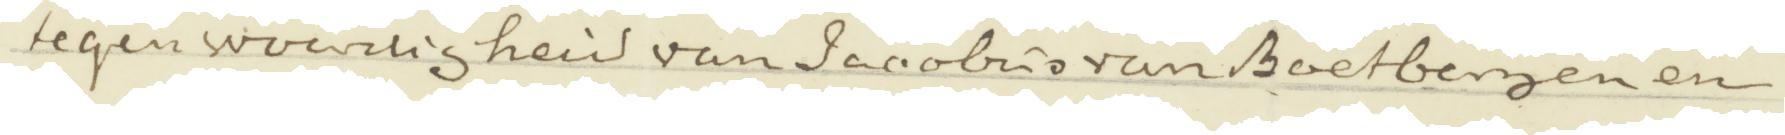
tegenwoordigheid van Jacobus van Boetbergen en
